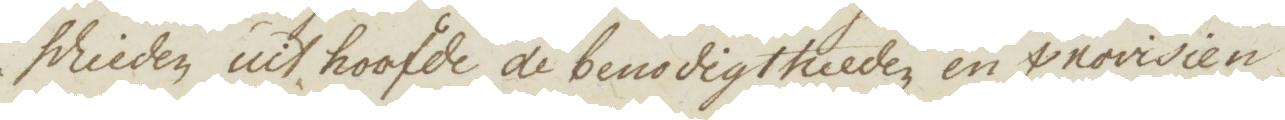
„schieden uit hoofde de benodigtheeden en provisien
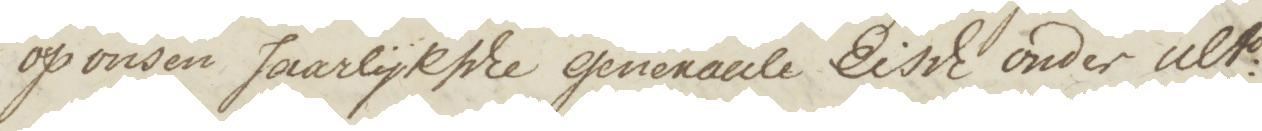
op onsen Jaarlijksche generaale Eisch onder ult:o
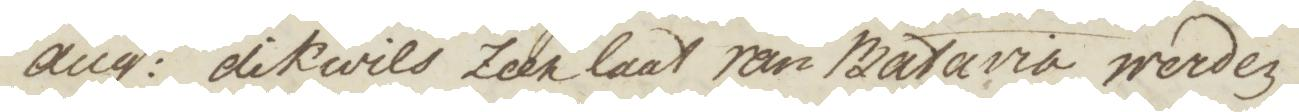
aug: dikwils zeer laat van Batavia werden
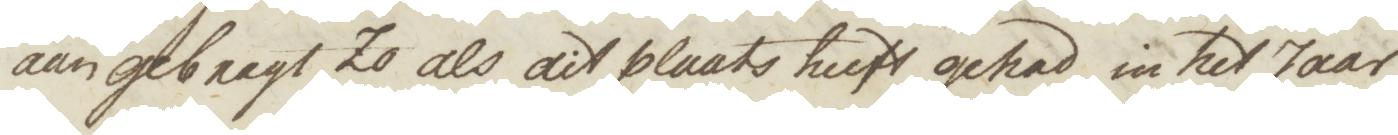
aangebragt zo als dit plaats heeft gehad in het Jaar
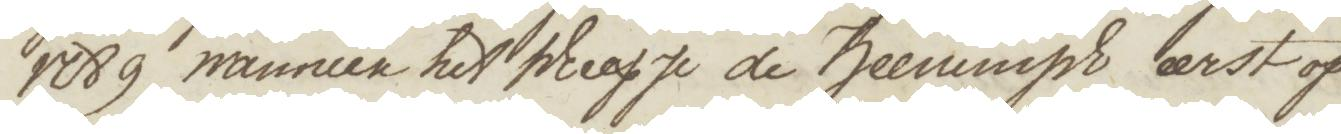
1789 wanneer het scheepje de Zeenimph eerst op
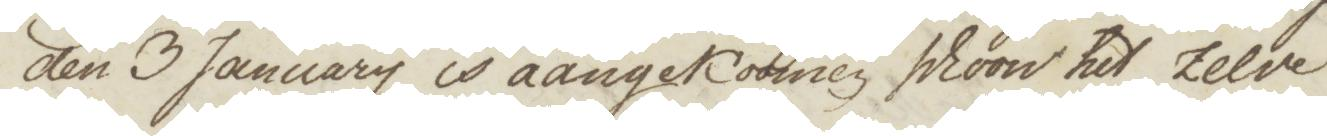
den 3 Januarij is aangekoomen schoon het zelve
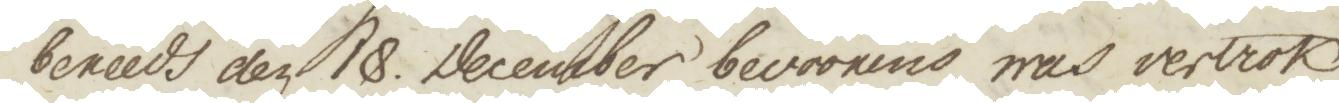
bereeds den 18. December bevoorens was vertrok
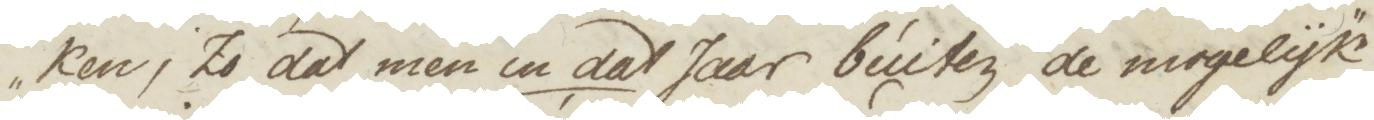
„ken, zo dat men in dat Jaar buiten de mogelijk„
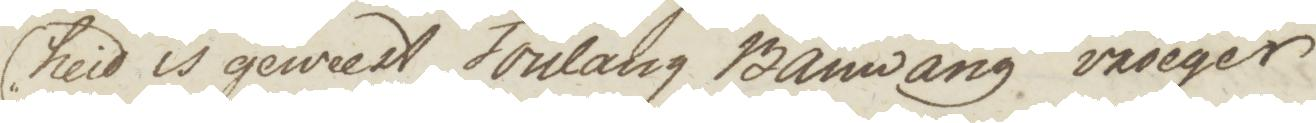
„heid is geweest Toulang Bauwang vroeger
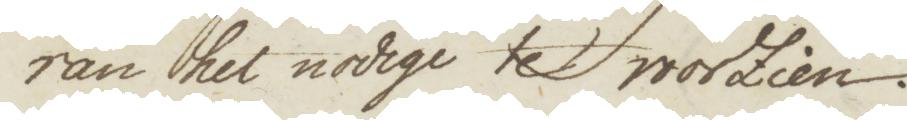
van het nodige te voorzien
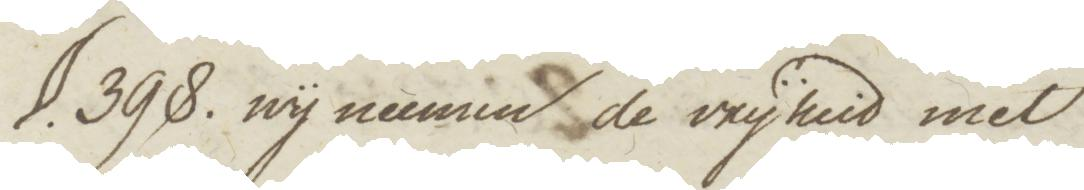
§. 398. wij neemen de vrijheid met
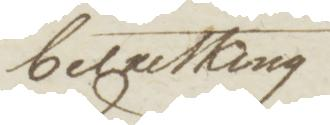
betrekking
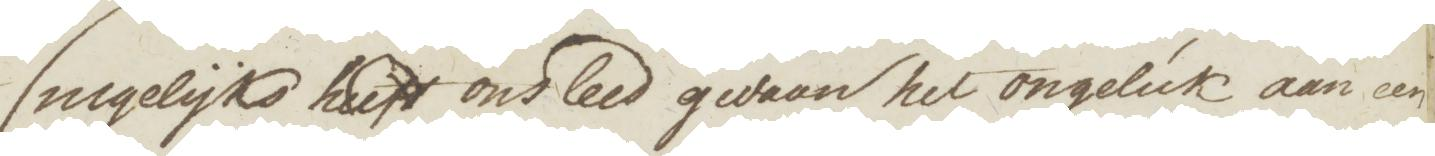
Jnsgelijks heeft ons leed gedaan het ongeluk aan een
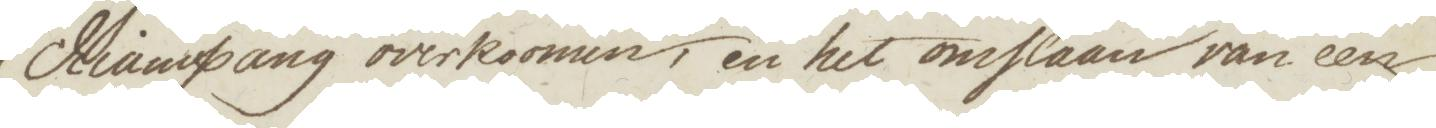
chiampang overkoomen, en het omslaan van een
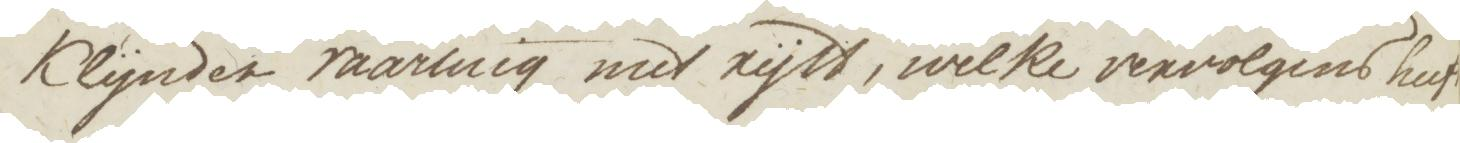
klijnder vaartuig met rijst, welke vervolgens heef
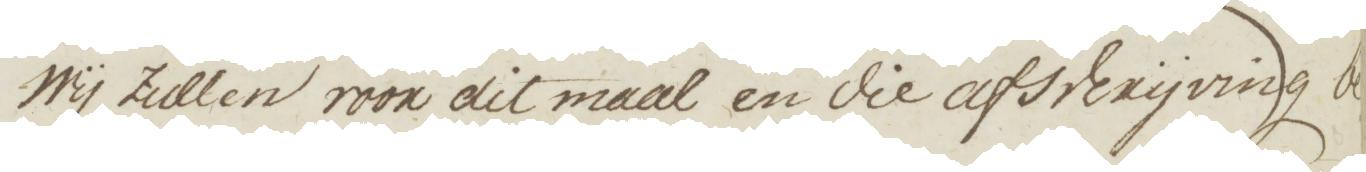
wij zullen voor dit maal en die afschrijving be
